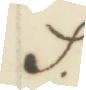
s.
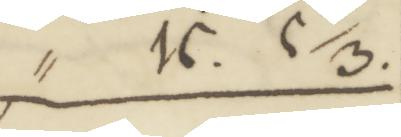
„ 15. 5 1/3.
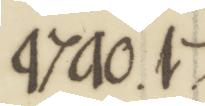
4740.1 9/15
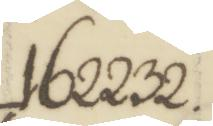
162232.
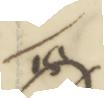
7. 7/15
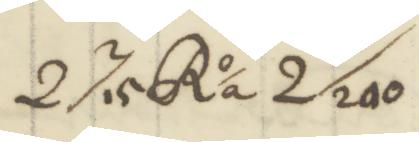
2 2/15 Ro/a 2 89/240
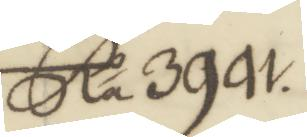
Ro/a 3941.
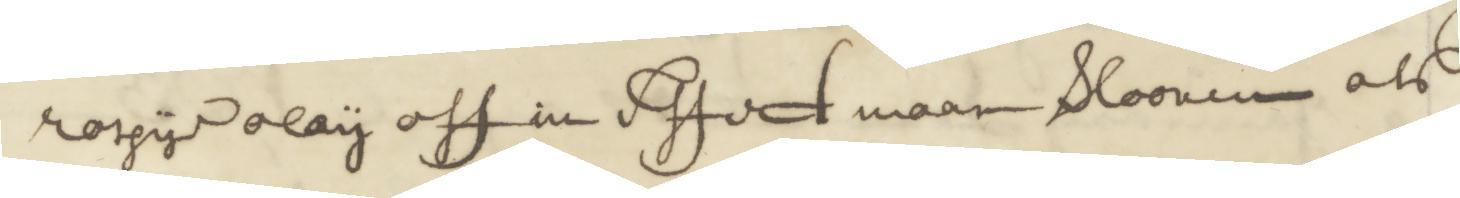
ropije olaij off in Effect maar verlooren als
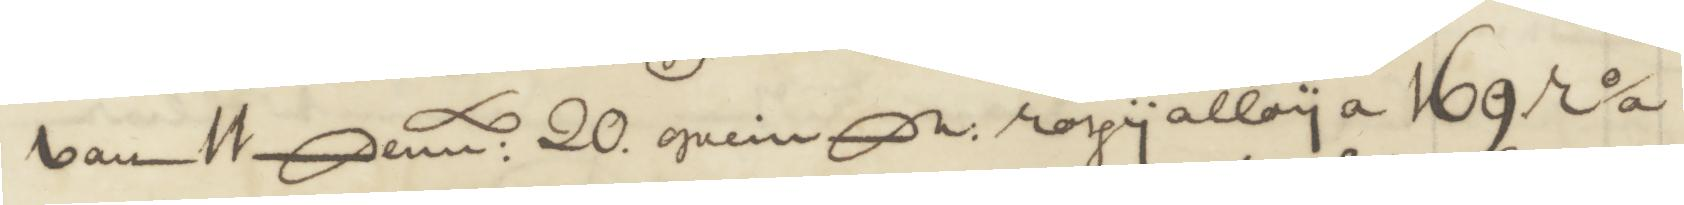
van 11 penn: 20. grein pr: ropij allaij a 169 ro/a
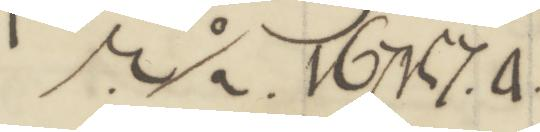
. ro/a. 16757.4
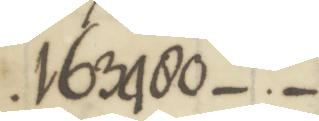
. 163480 – . –
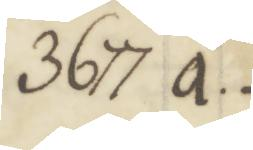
3677 4.
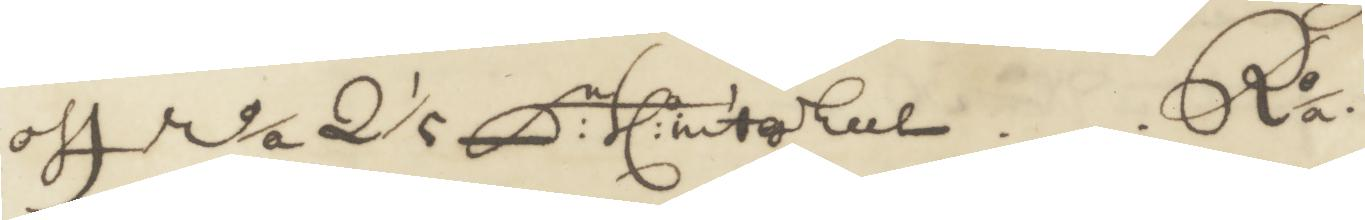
off ro/a 2 1/5 p:r tC:o in't geheel . . R.o/a
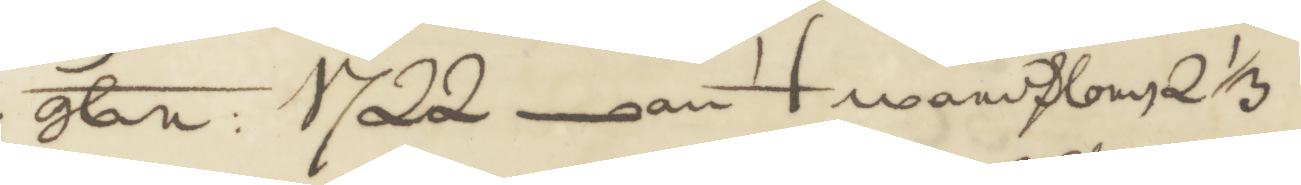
gbr: 1722 van ’t ware verloren 2 1/3
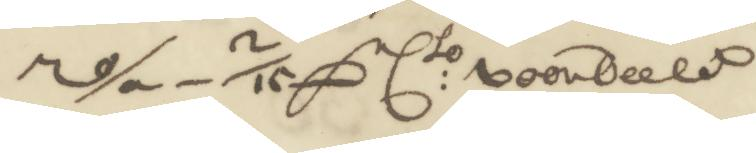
ro/a - 1/50 p C:t voordeele
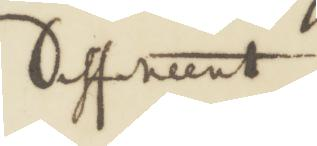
differeert
